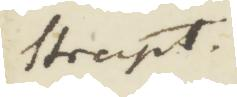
streept.
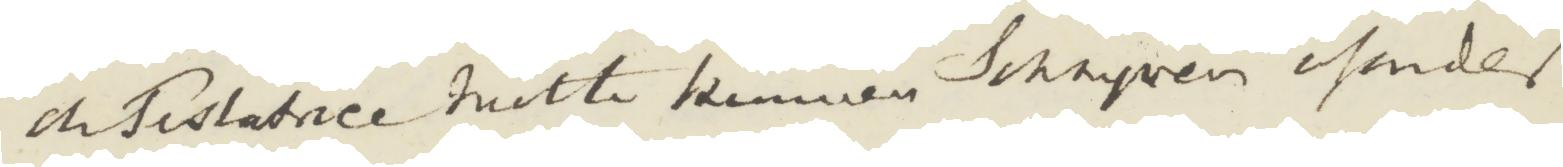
de Testatrice niet te kunnen schryven of onder
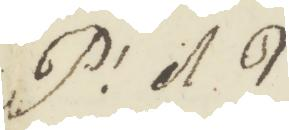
P: d V
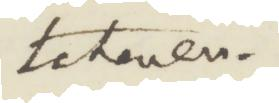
tekenen.
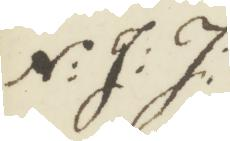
N: J: J:
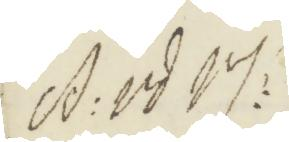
A: vd VJ.r
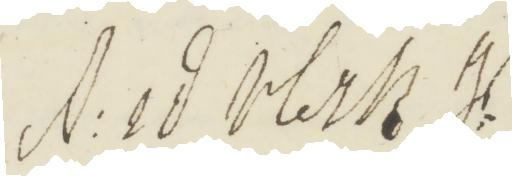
A. vd Vlerk Jr.
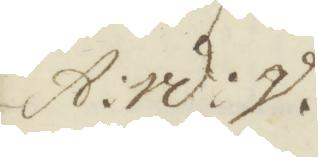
A:vd:V.
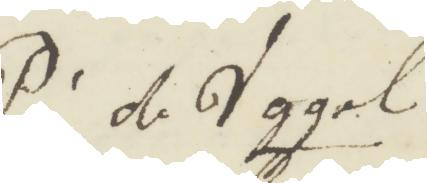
P: de Vggel
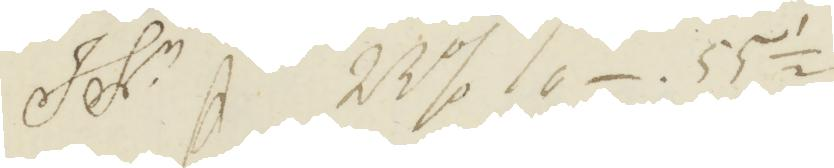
JS.n 23% „ —. 55½
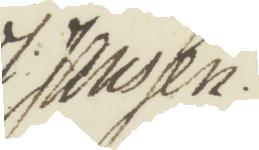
NJ: Janssen.
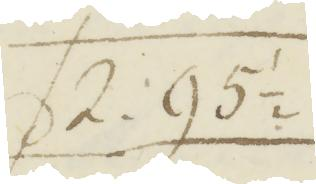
ƒ2:95½
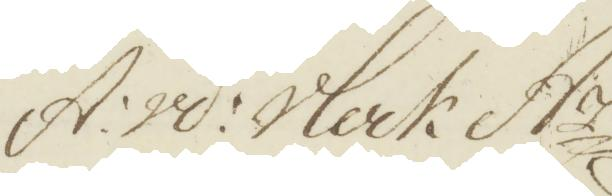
A: vd: Vlerk A=z
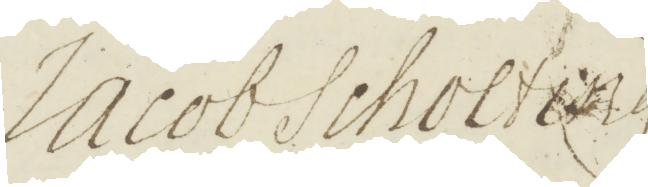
Jacob Scholtin
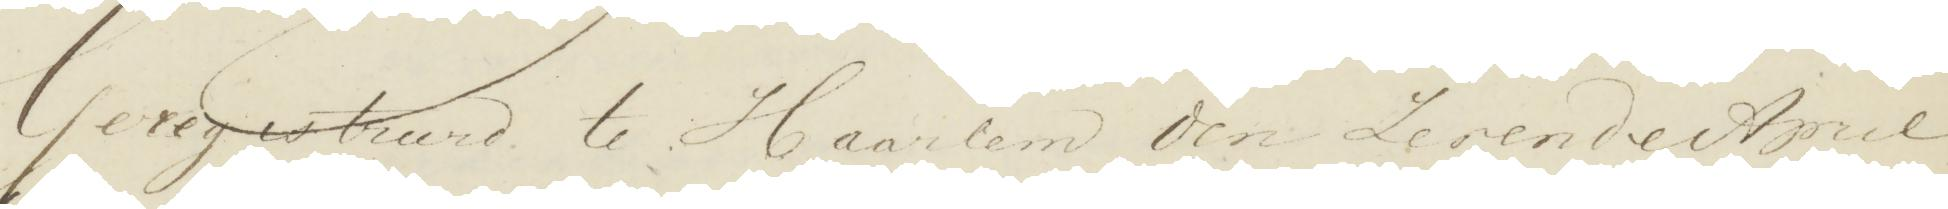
Geregistreerd, te Haarlem den Zevende April
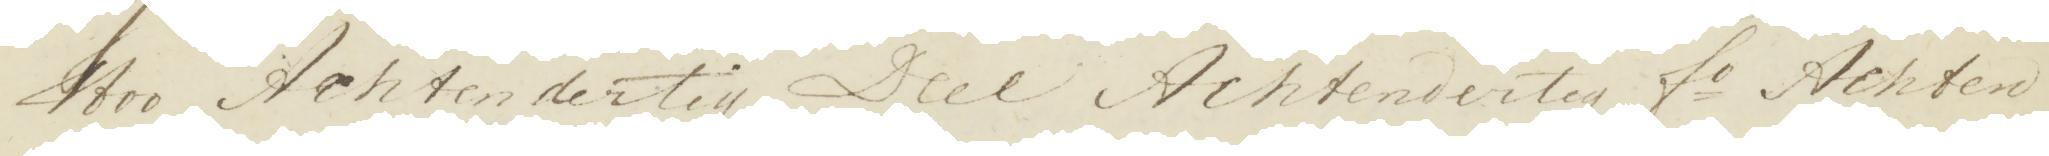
1800 Achten dertig Deel Achtendertig f=o Achten
